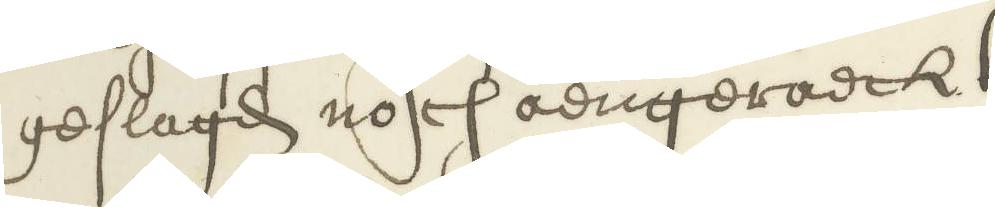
geslagen noch aengeraeckt
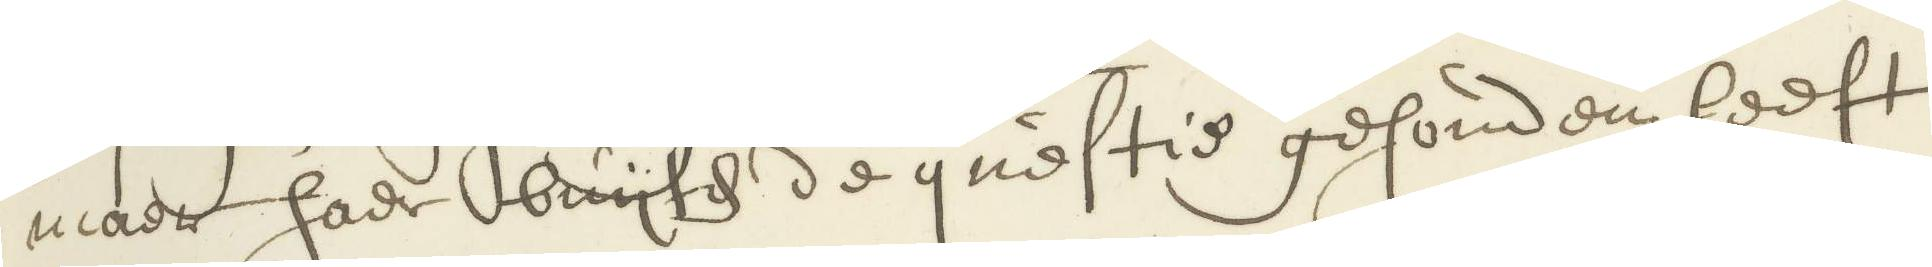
maer haer buijten de questie gehouden heeft
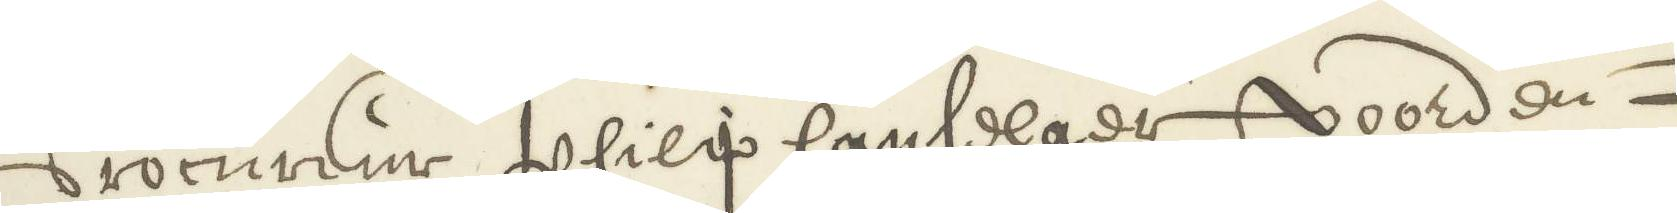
Procureur philip Canselaer voorden Ged=e
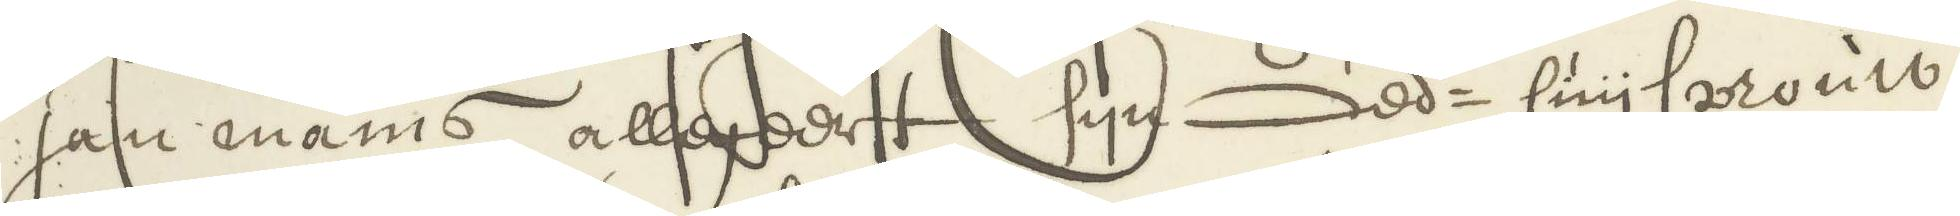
jan manis allegeert syn Ged=s huijsvrouw
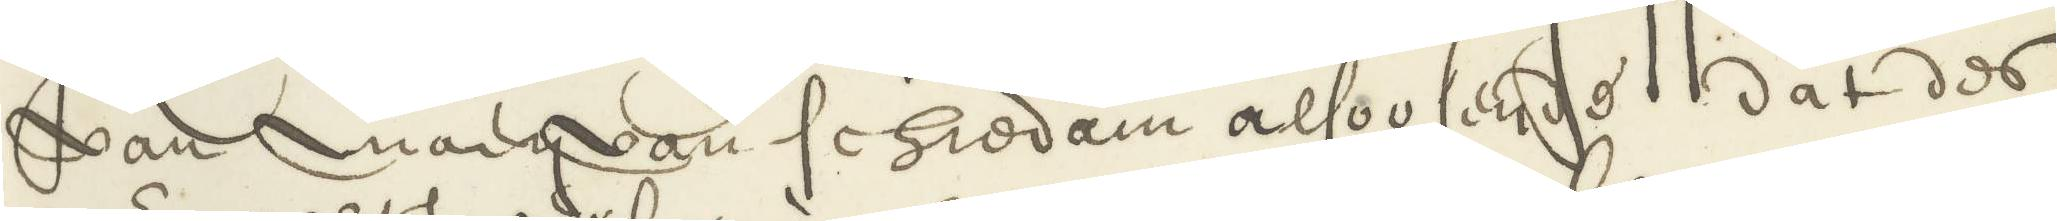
van maey van schiedam alsoo seyde dat des
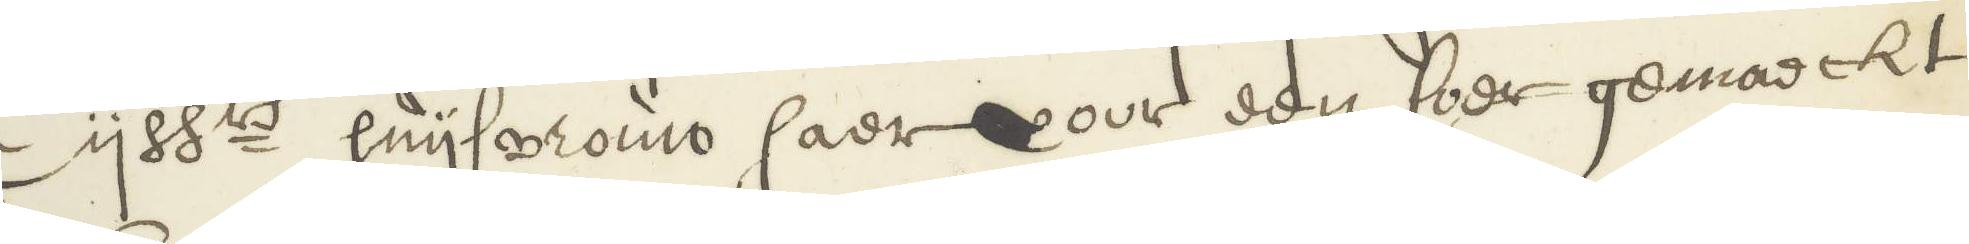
Eijss=rs huijsvrouw haer voor een hoer gemaeckt
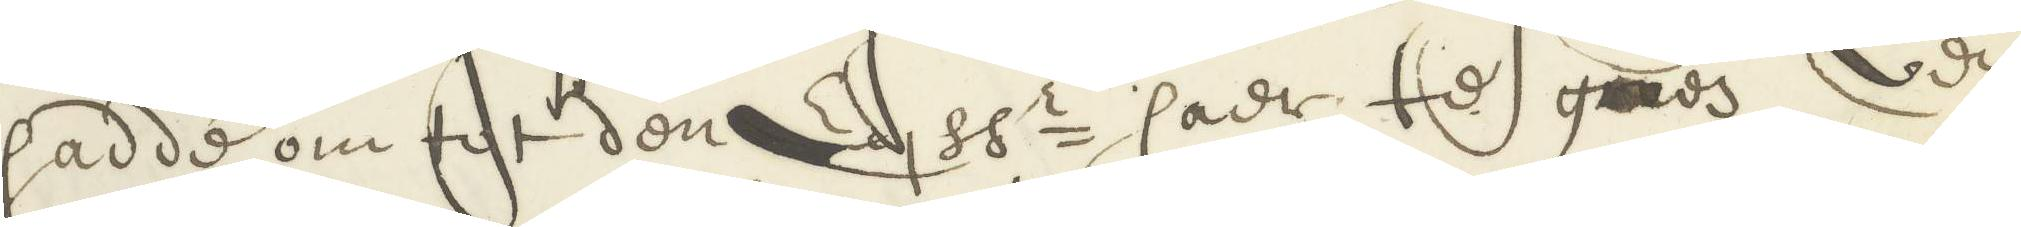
hadde om tot den Eyss=r haer te gaen ver
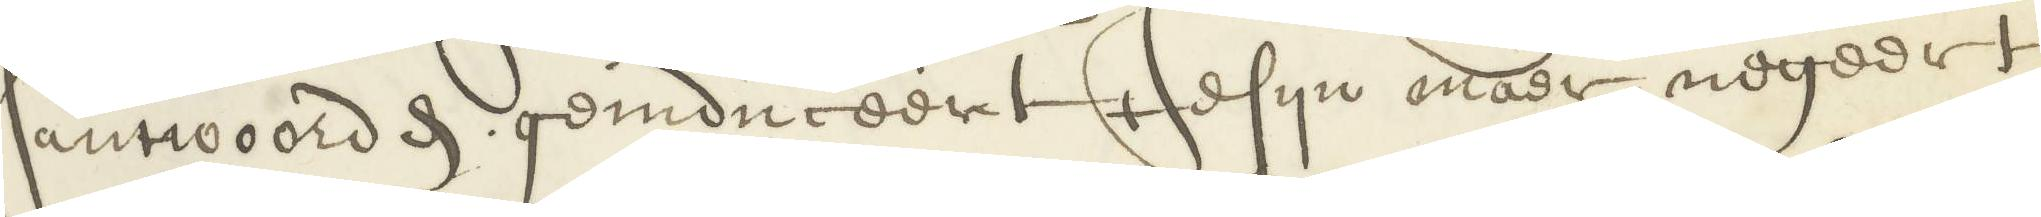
antwoorden geinduceert te syn maer negeert
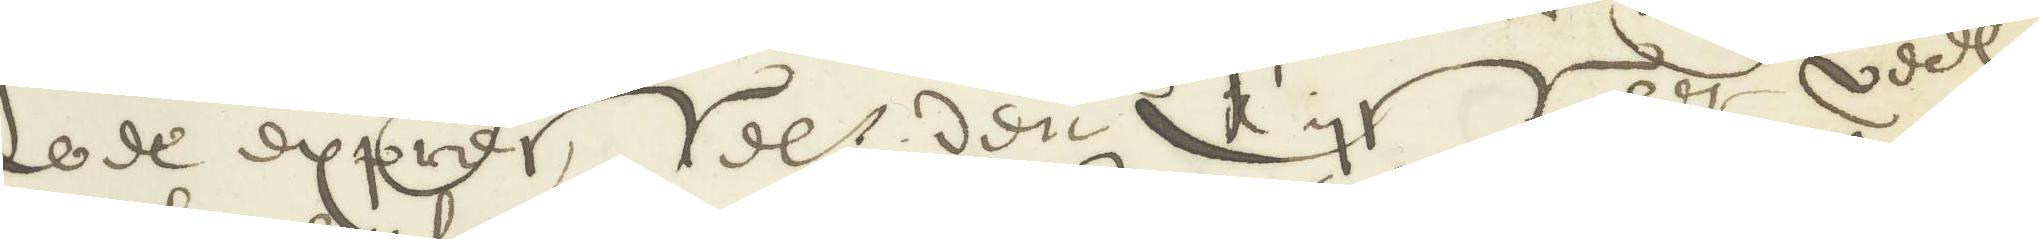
wel expresselijk den Eijsscher veel
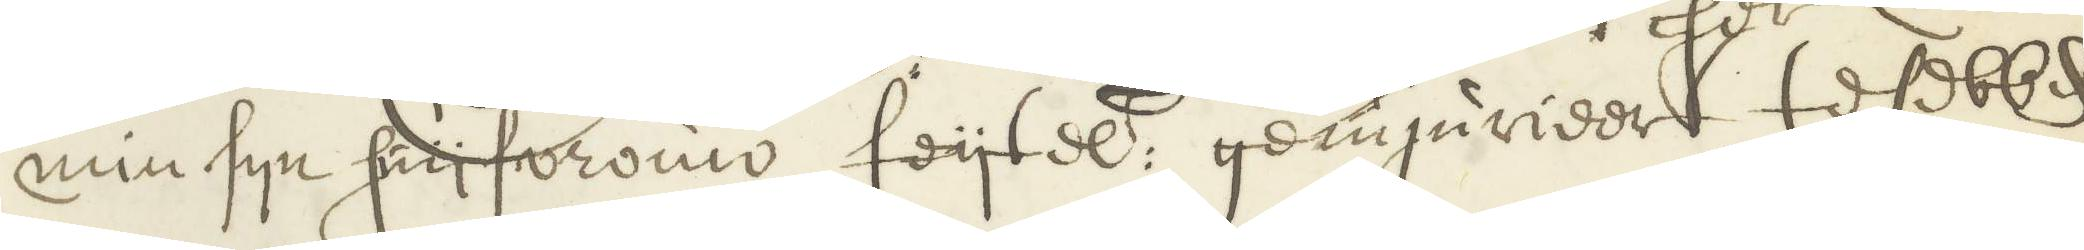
min syn huijsvrouw feijtelijk geinjurieert te hebben
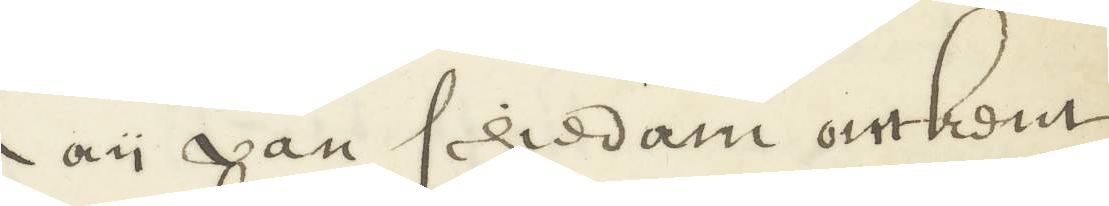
D' Ged:e Maij van schiedam ontkent
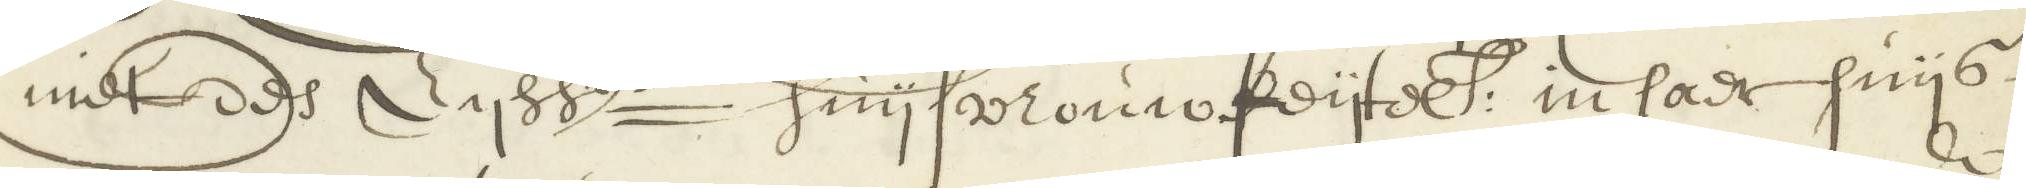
niet des Eyss=rs huijsvrouw feijtelijk in haer huijs
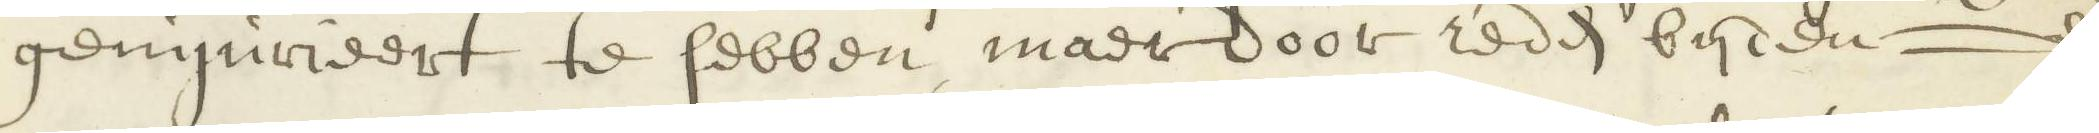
geinjurieert te hebben, maer door reden by den Ged=e
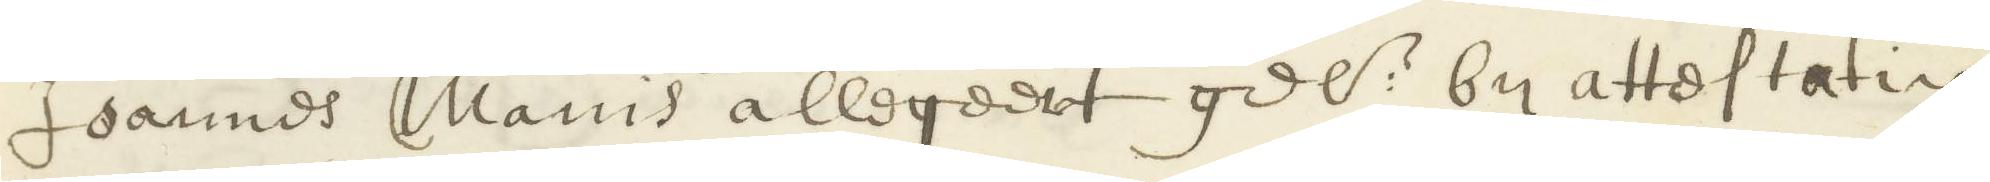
Joannes Manis allegeert gelijk by attestatie
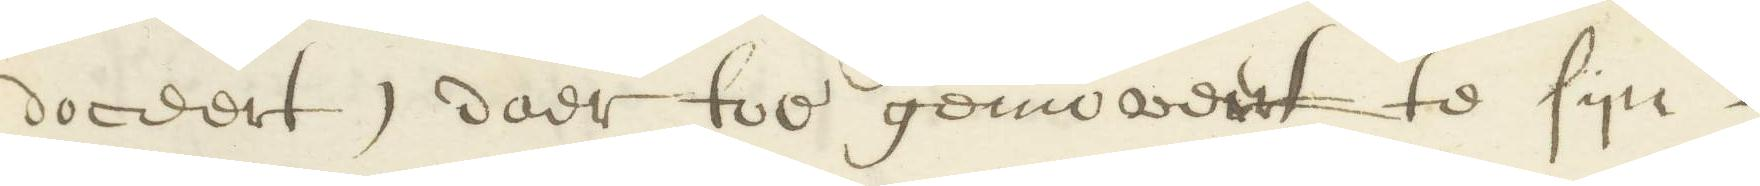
doceert ) daer toe gemoveert te sijn
